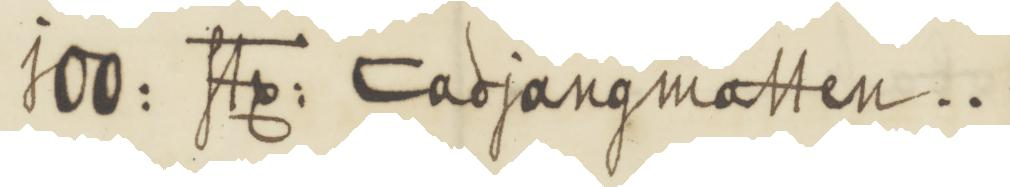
100: stx: cadjangmatten . .
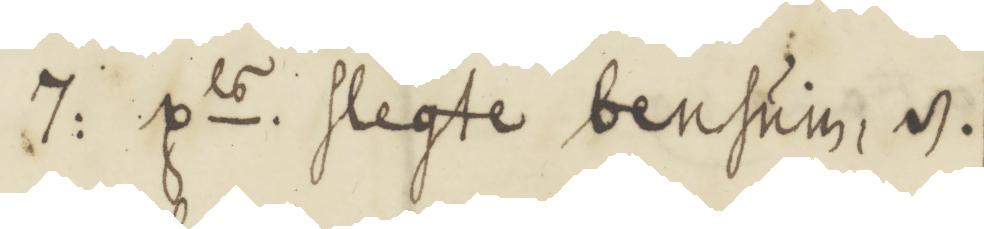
7: p-ls. slegte bensuin, en .
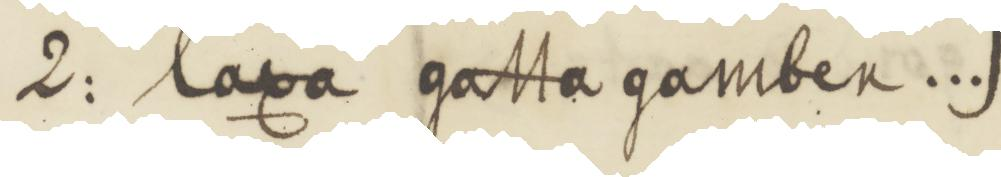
2: laxa gatta gamber . . .
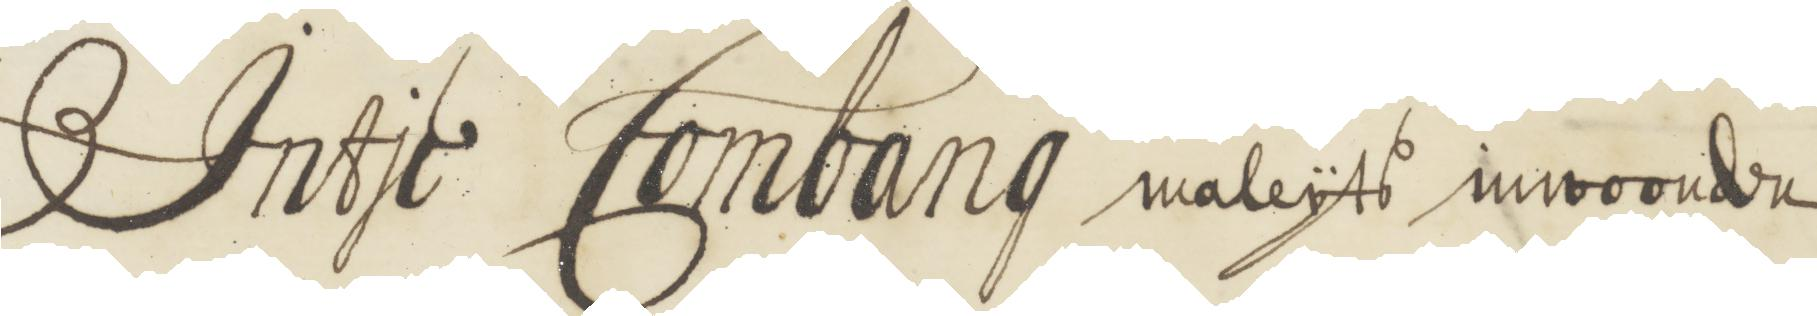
Intje Combang maleijts inwoonder Primo Maart.
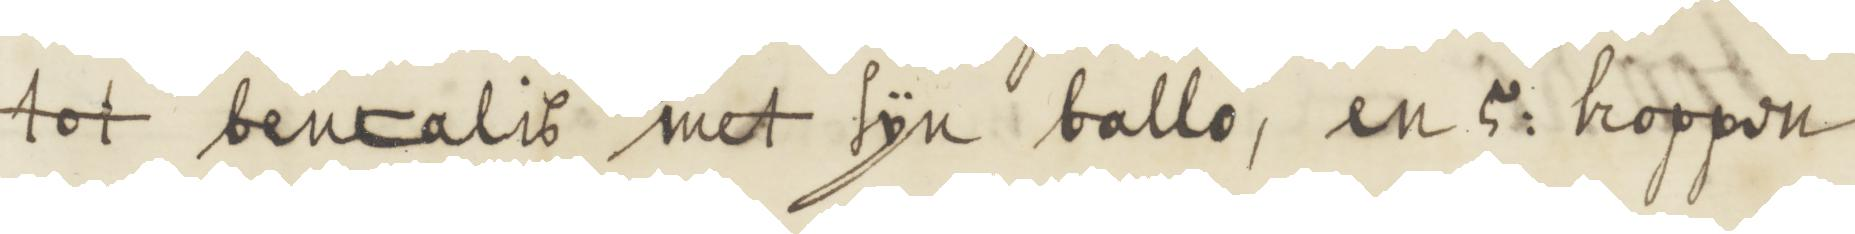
tot bencalis met sijn ballo, en 5: koppen
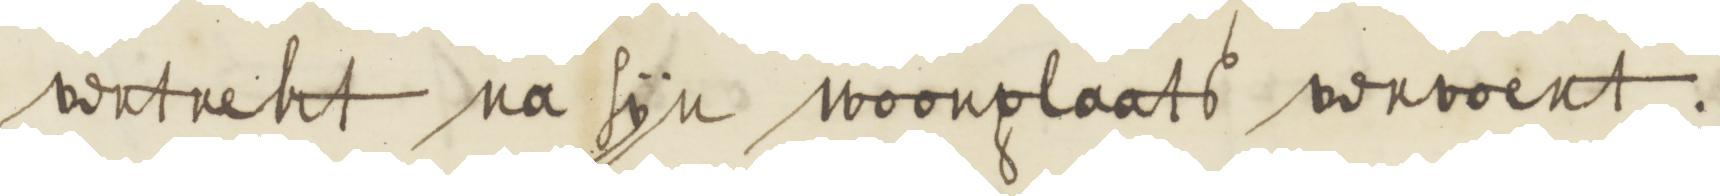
vertrekt na sijn woorplaats vervoert.
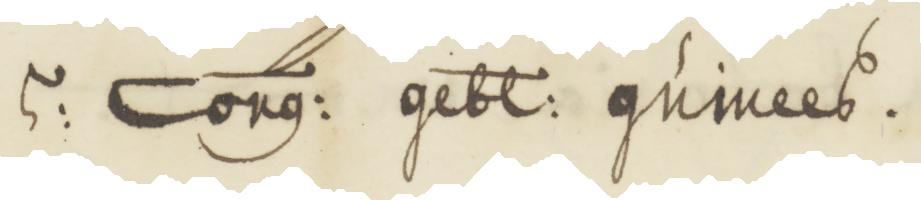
5: corg: gebl: guinees.
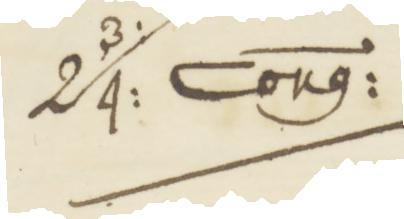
2¾: corg:
